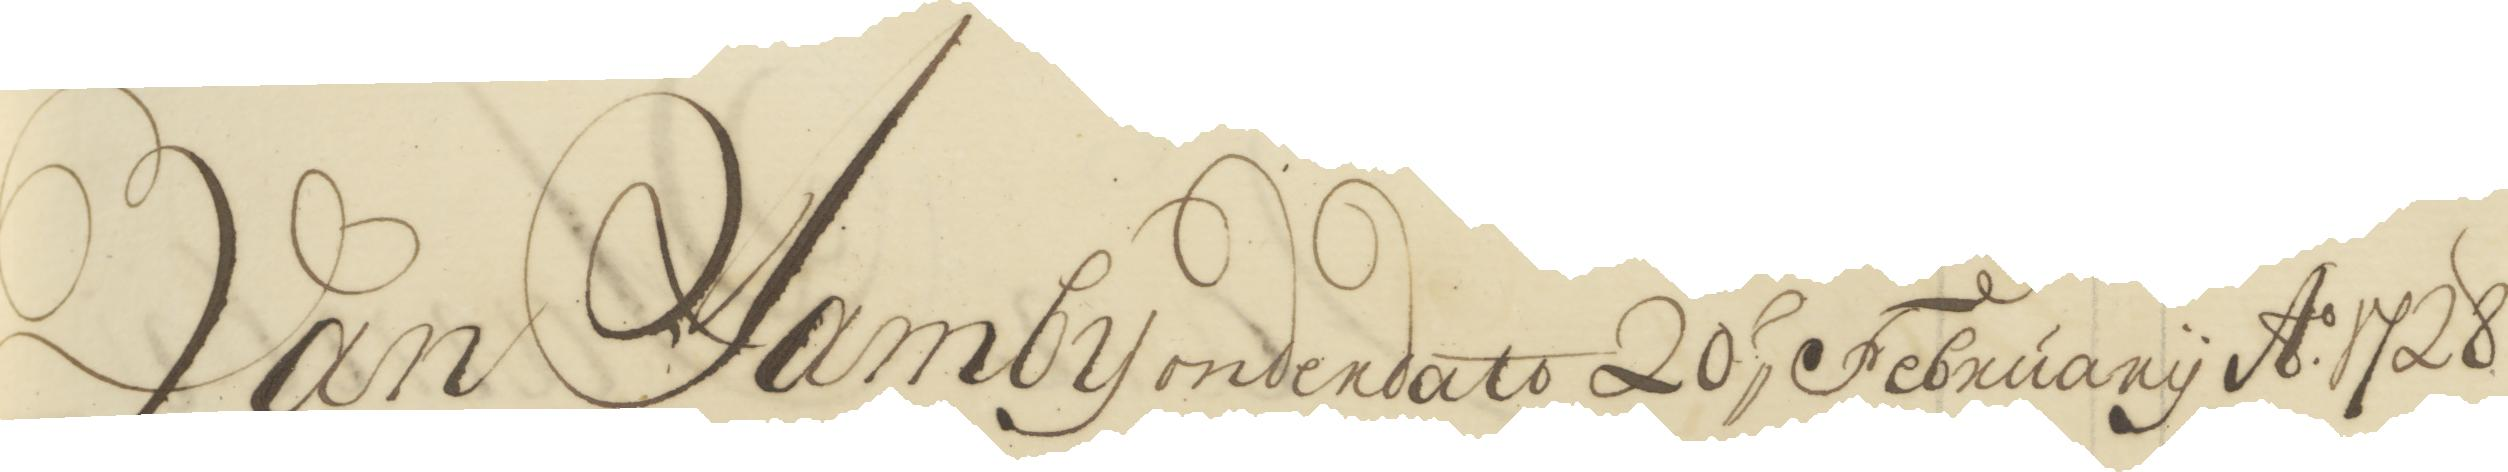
Van Jamby onder dato 20„ Februarij Ao. 1728
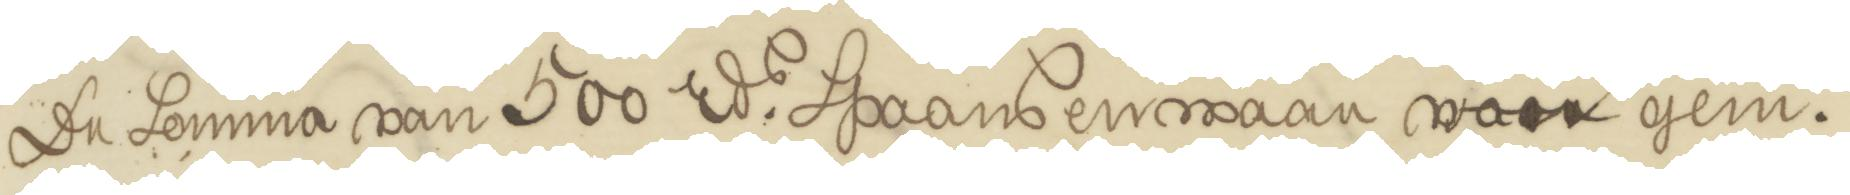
De somma van 500 Ed:s spaansen waar voor gem:
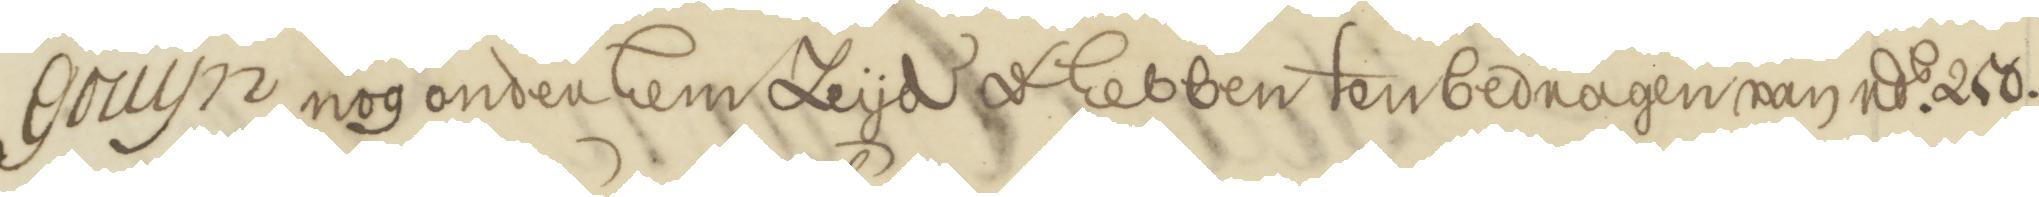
gouijn nog onder hem Zeijde te hebben ten bedragen van rd.s 250.
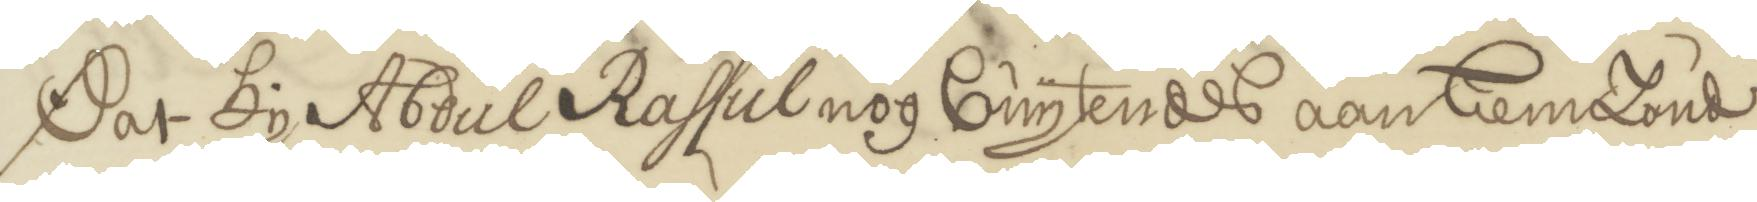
Dat bij Abdul Rassul nog buijtendes aan hem zoude
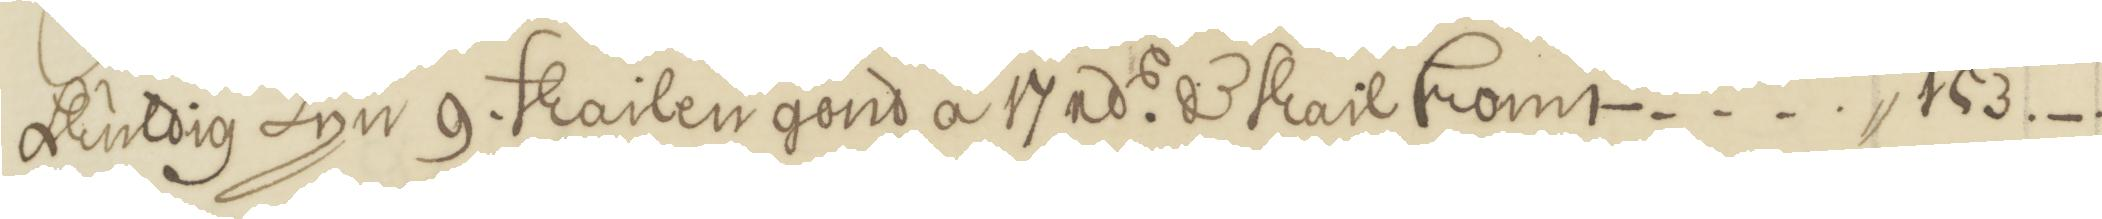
Schuldig sijn 9. Kailen goud a 17 rd.s de Kail komt - - - - „ 153.–.
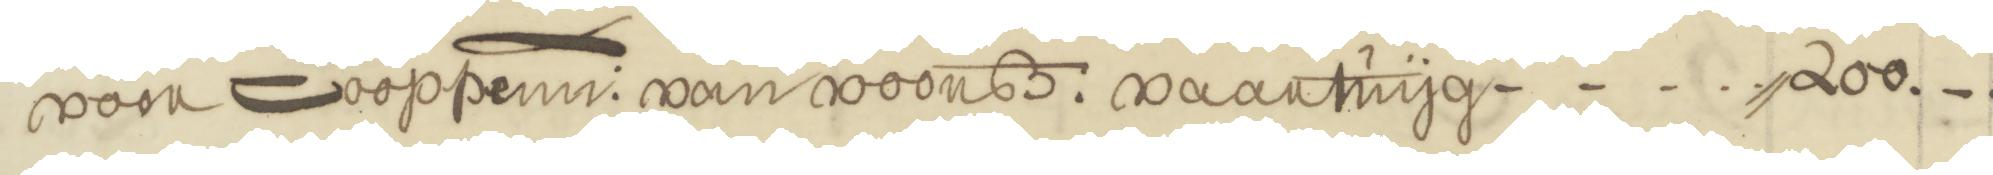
voor cooppenn: van voorbe: vaartuijg - - - - „200.–.
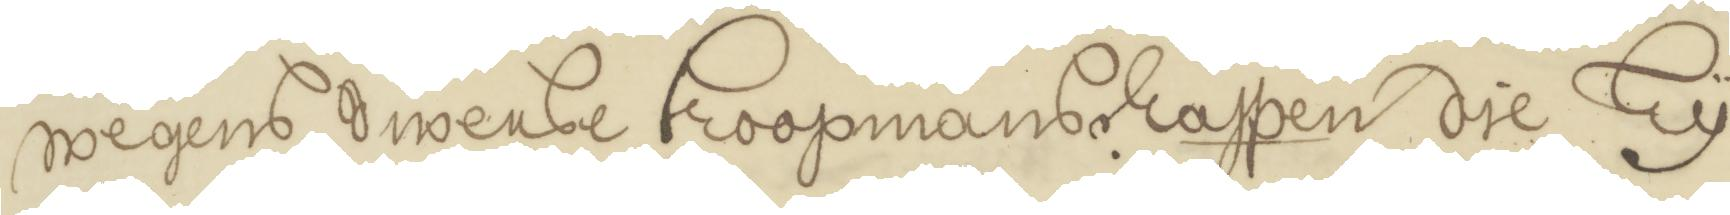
wegens diverse koopmanschappen die hij
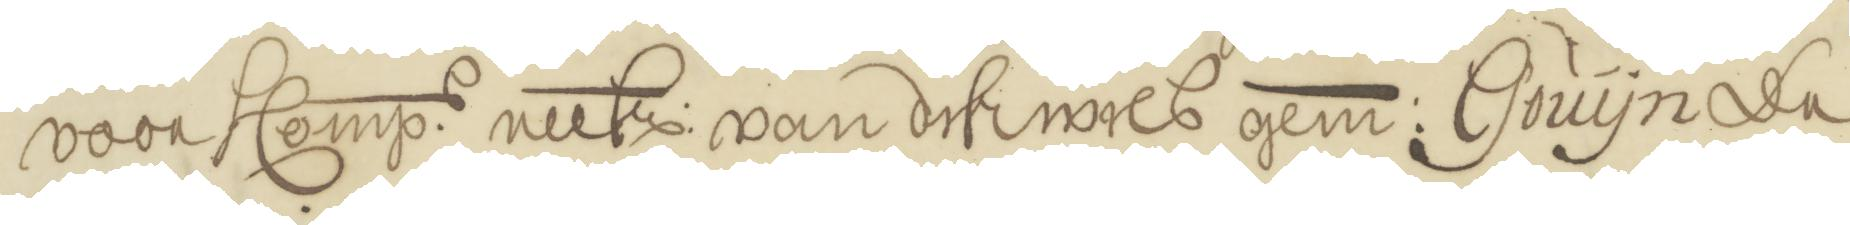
voor Comp:s reets van dik wils gem: Gouijn ter
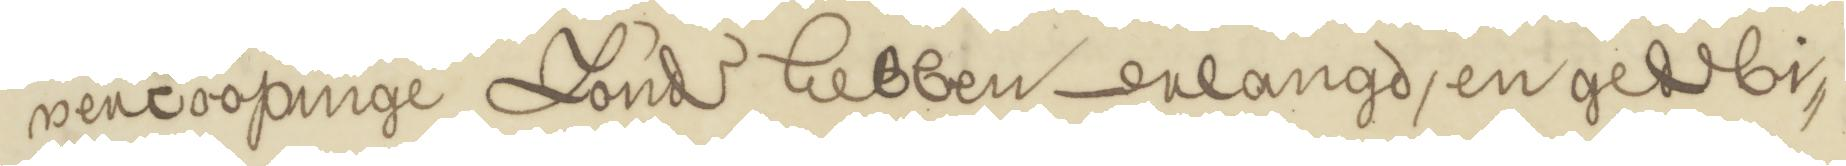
vercoopinge zoude hebben verlangd, en gedebi„
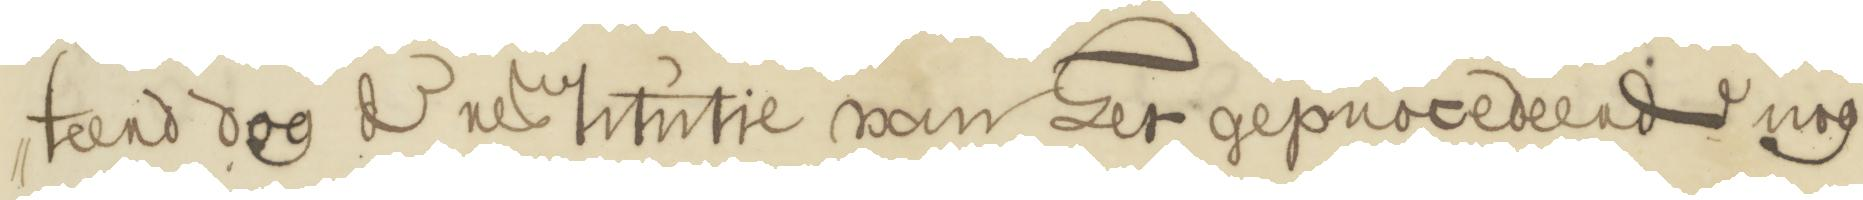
„teerd dog de restitutie van het geprocedeerde nog
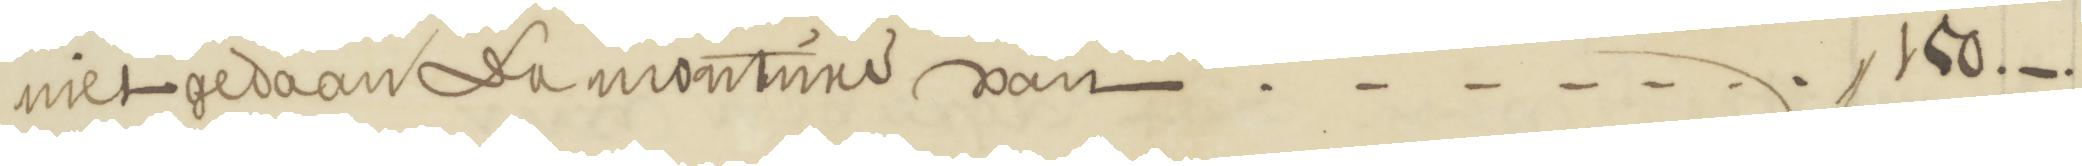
niet gedaan de monture van - - - - - - - „150.–.
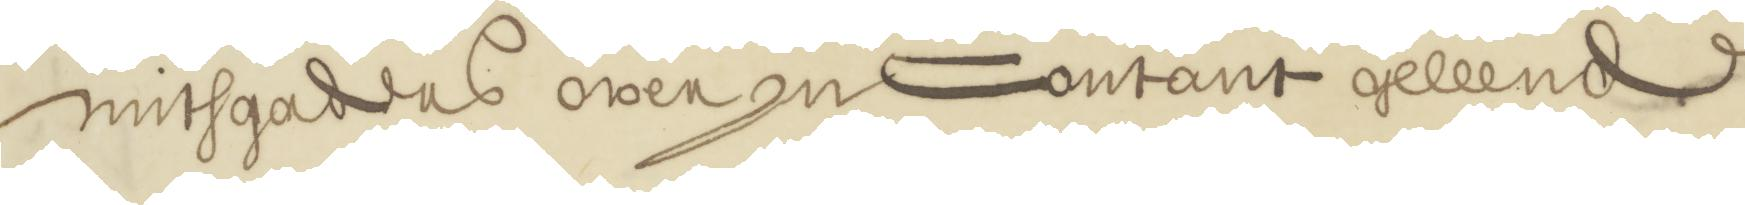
mitsgaders over jn Contant geleende
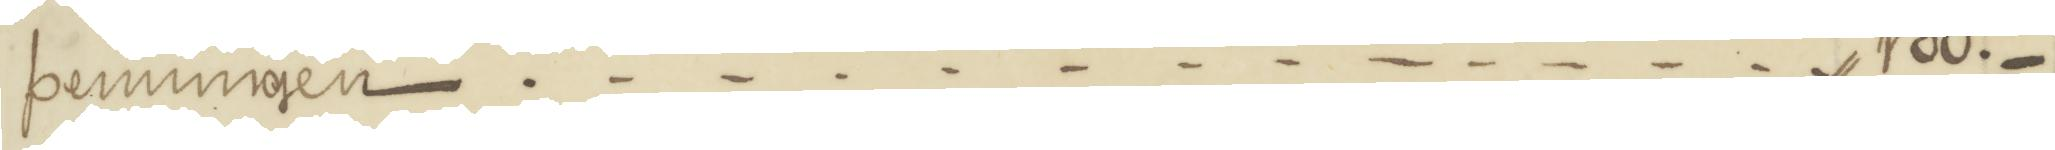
Penninigen - - - - - - - - - - - - - - „180.–
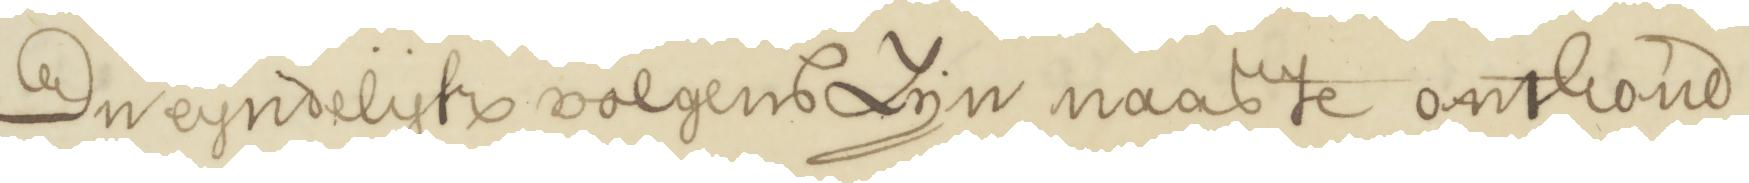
En eijndelijk volgens Zijn naaste onthoud
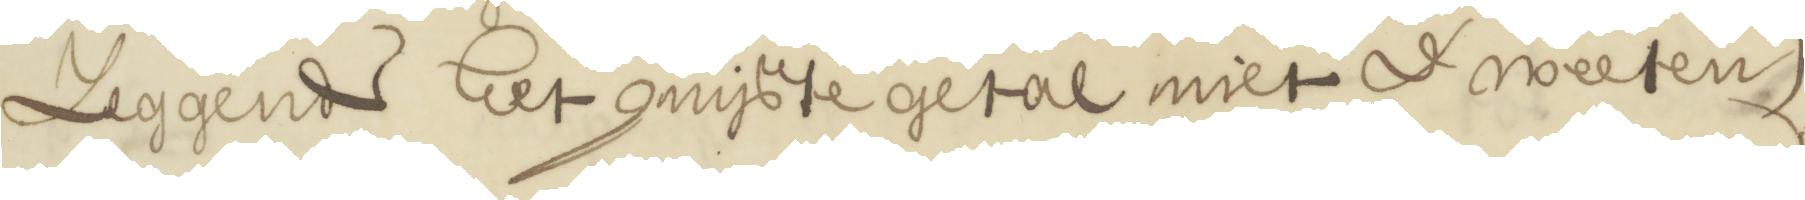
Zeggende het juijste getal niet te weeten
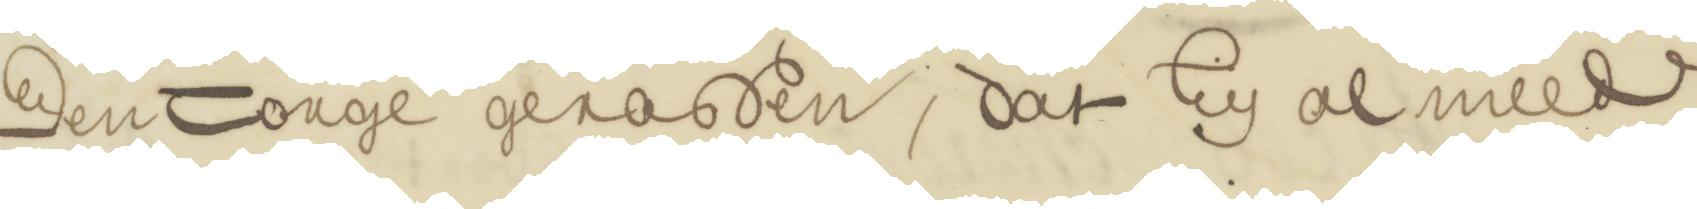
Een Conge gerassen, dat hij al meede
